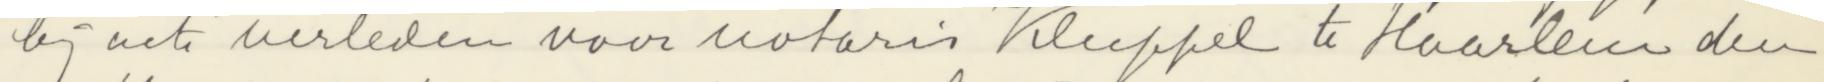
bij acte verleden voor notaris Kluppel te Haarlem den
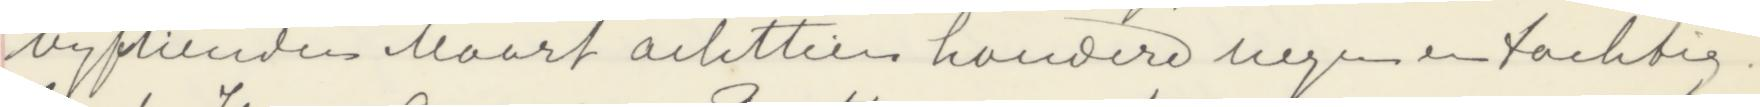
vijftienden Maart achttien honderd negen en tachtig.
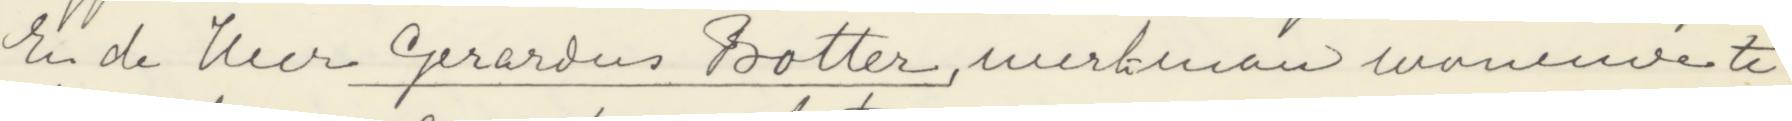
En de Heer Gerardus Botter, werkman wonende te
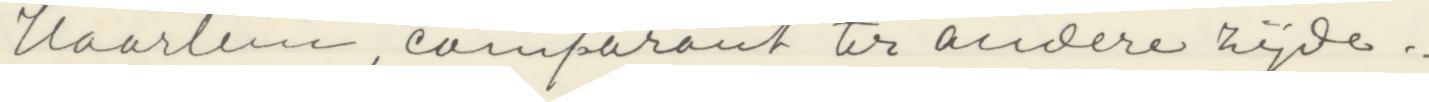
Haarlem, comparant ter andere zijde.
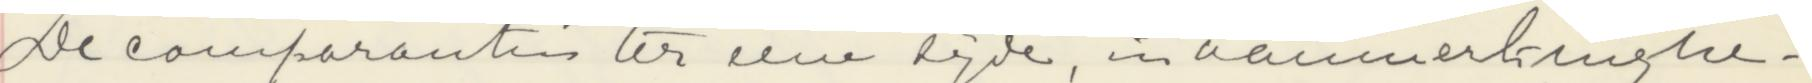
De comparanten ter eene zijde, in aanmerking ne-
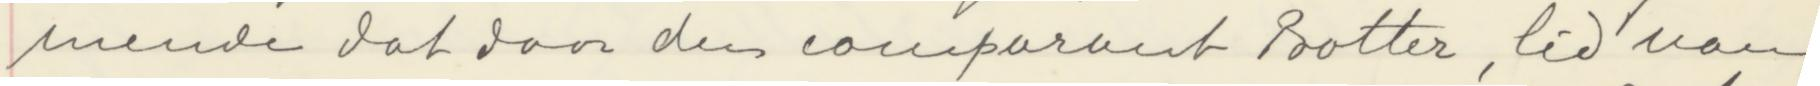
mende dat door den comparant Botter, lid van
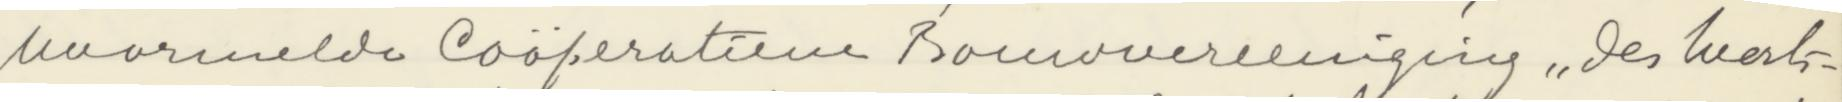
voormelde Coöperatieve Bouwvereeniging „des Werk-
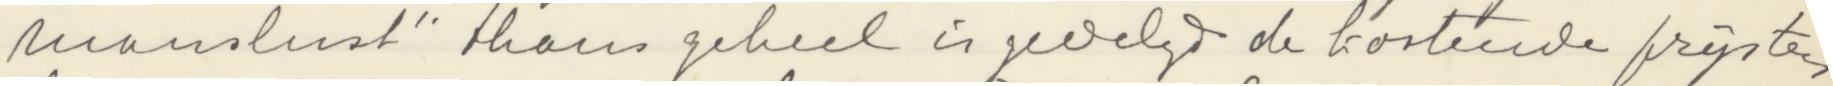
manslust" thans geheel is gevelgd de kostende prijs ten
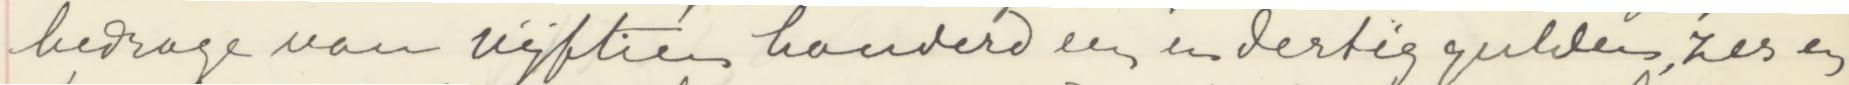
bedrage van vijftien honderd een en dertig gulden, zes en
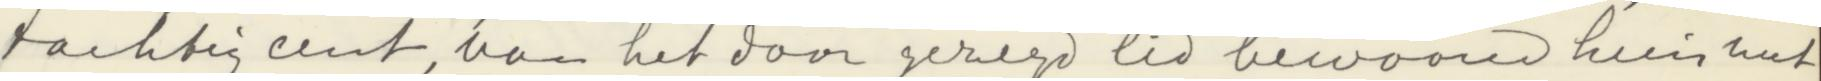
tachtig cent, van het door gezegd lid bewoond huis met
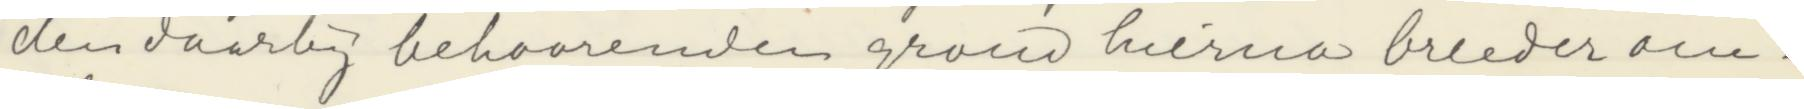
den daarbij behoorenden grond hierna breeder om-
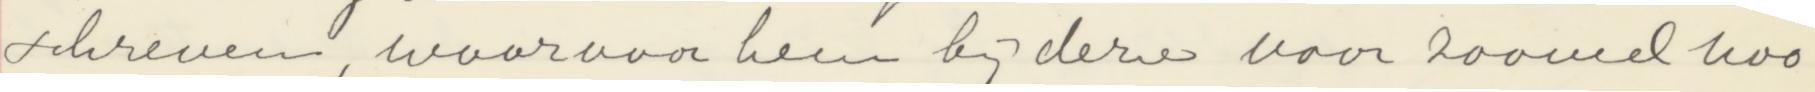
schreven waarvoor hem bij deze voor zooveel noo
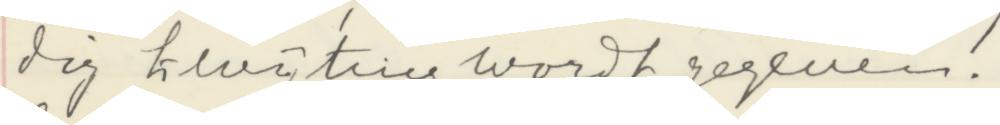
dig kwijting wordt gegeven.
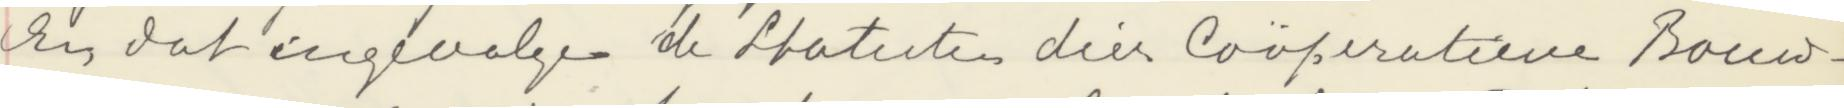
En dat ingevolge de Statuten dier Coöperatieve Bouw-
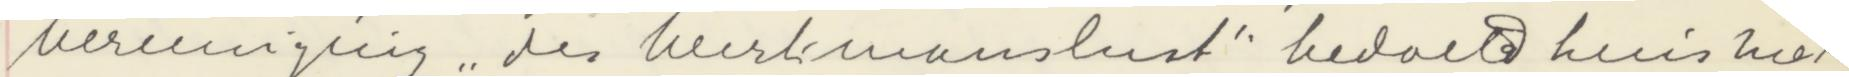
vereeniging „des Werkmanslust" bedoeld huis met
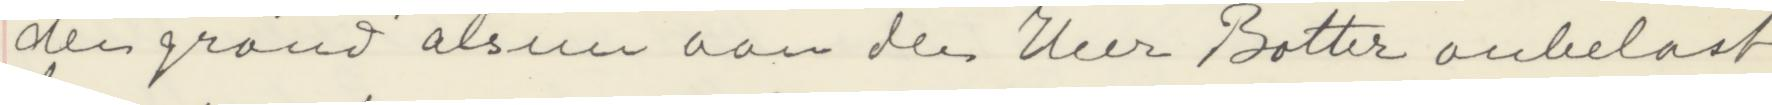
den grond als nu aan den Heer Botter onbelast
